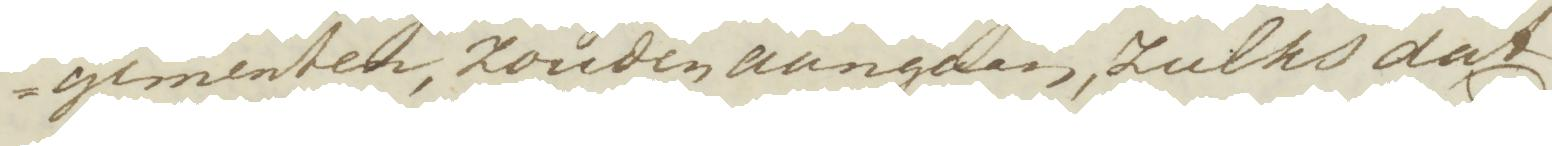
=gementen, zouden aangaan, zulks dat
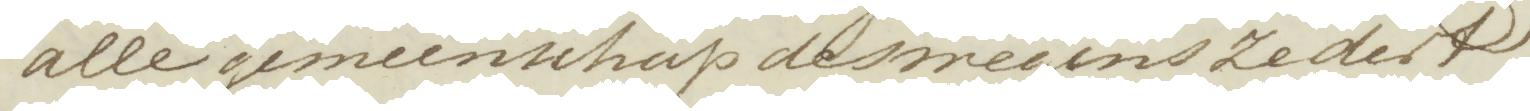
alle gemeenschap deswegens zedert
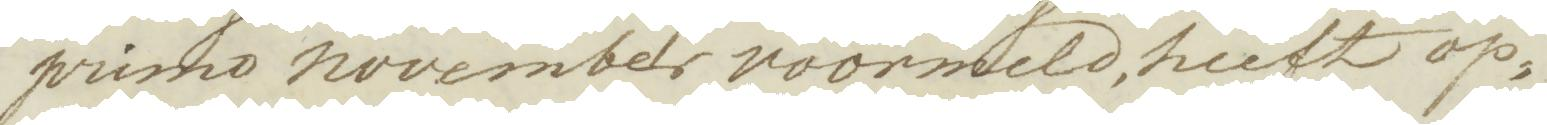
primo november voormeld, heeft op=
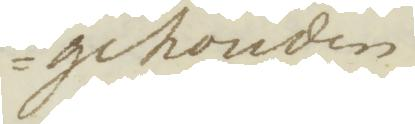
=gehouden
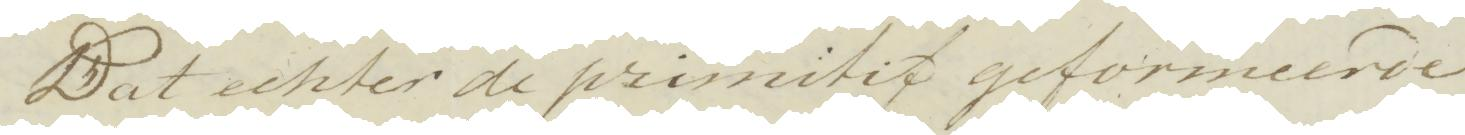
Dat echter de primitif geformeerde
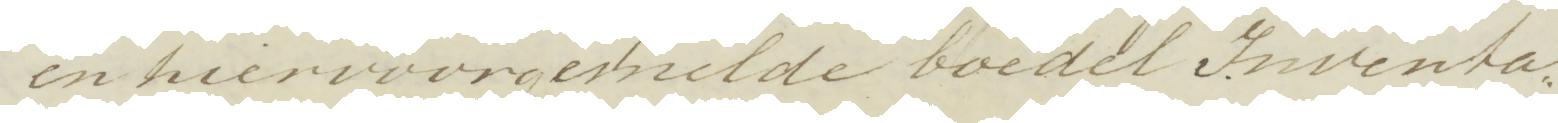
en hiervoorgemelde boedel Inventa„
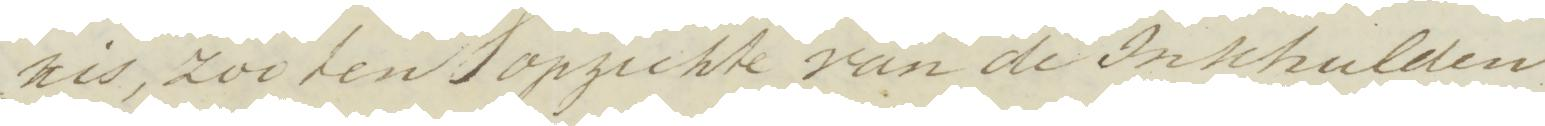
=ris, zoo ten opzichte van de Inschulden
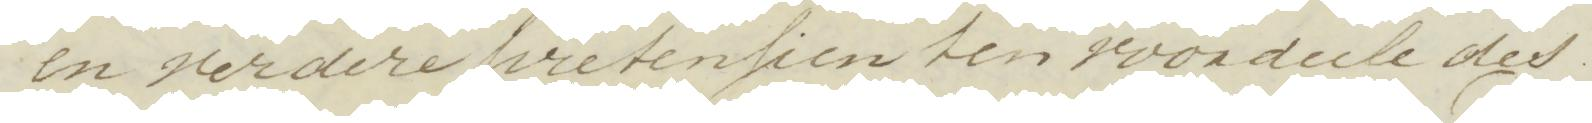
en verdere pretensien ten voordeele des
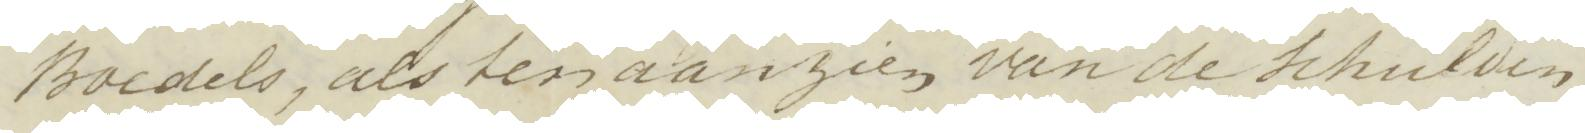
Boedels, als ten aanzien van de schulden
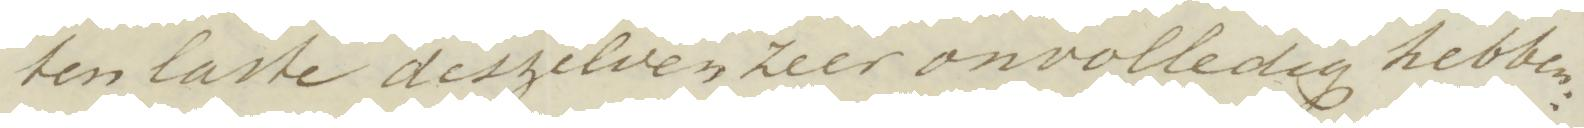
ten laste deszelven zeer onvolledig hebben:
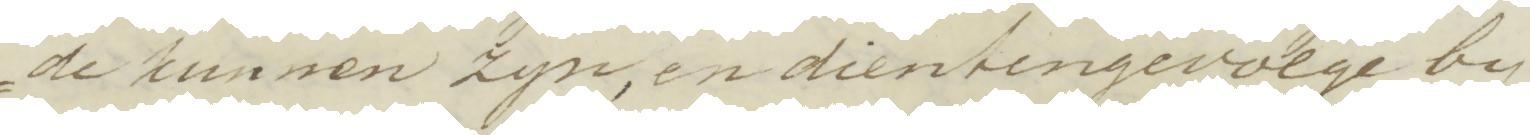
=de kunnen zyn, en dien tengevolge by
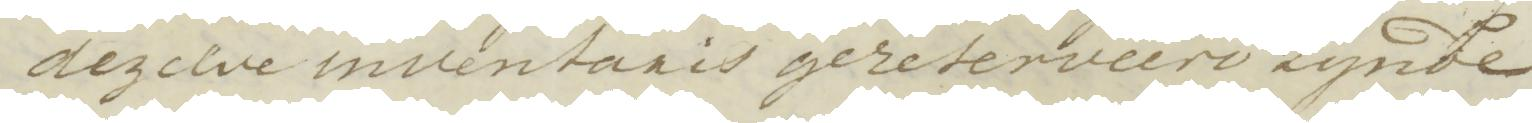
dezelve inventaris gereserveerd zynde
